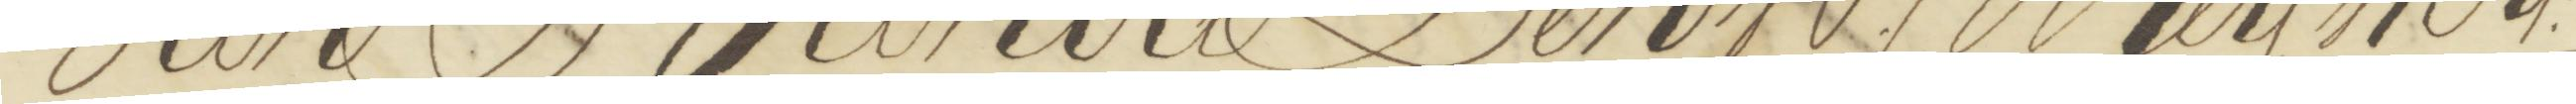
Van Banda Den 16: Meij 1734:
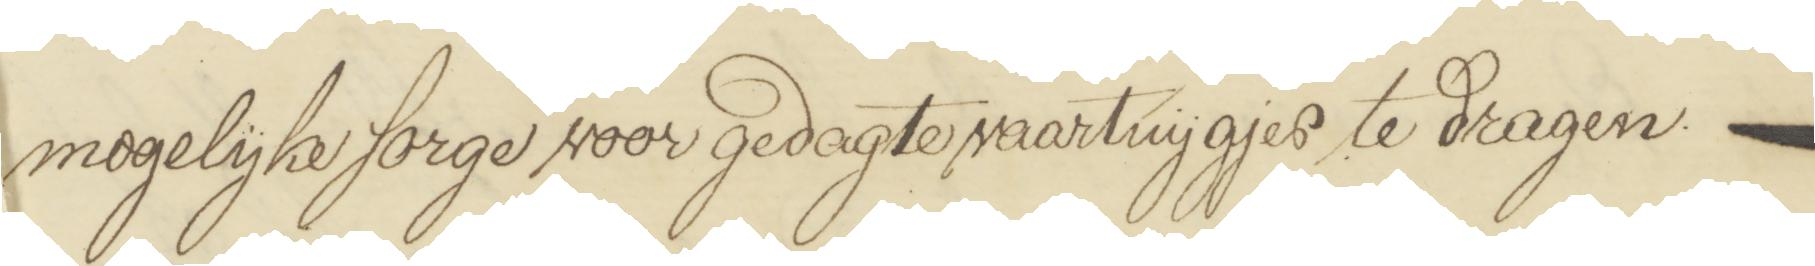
mogelijke sorge voor gedagte vaartuijgjes te dragen. —
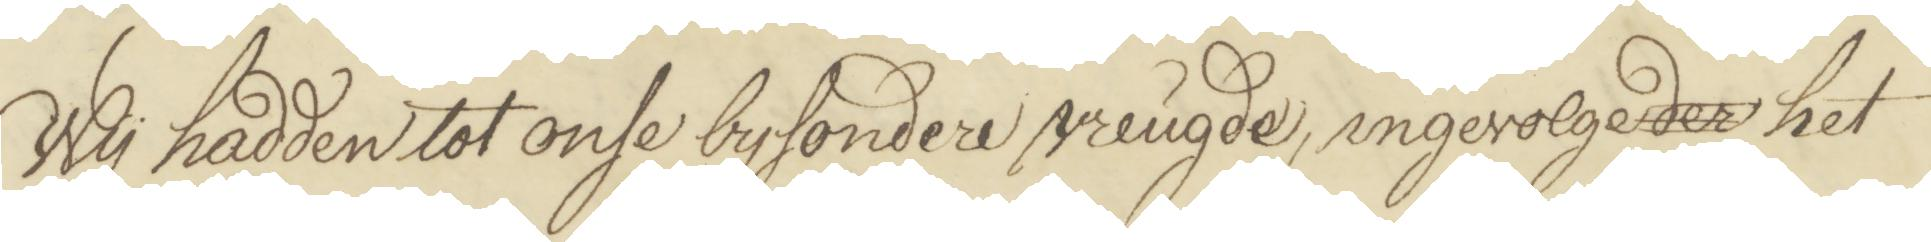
Wij hadden tot onse bysondere vreugde, ingevolgeder het
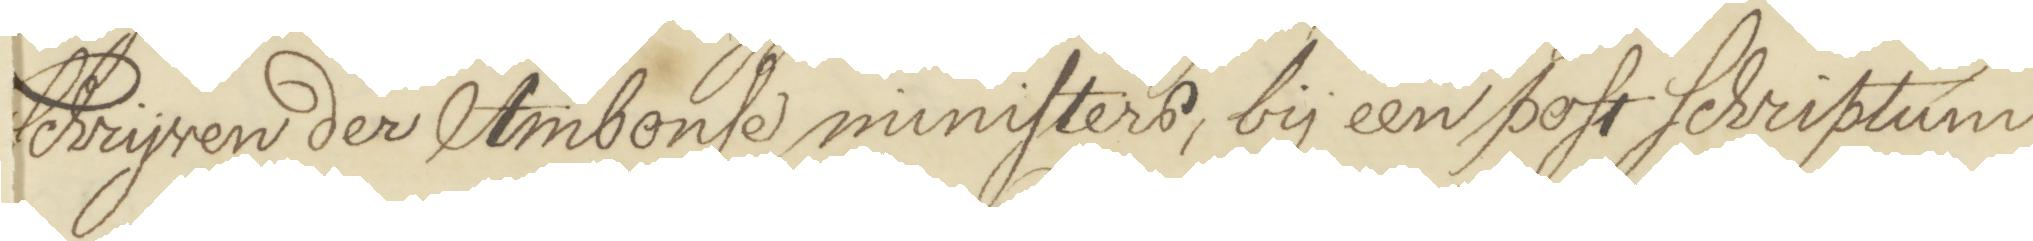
schrijven der Ambonse ministers, bij een post Schriptum
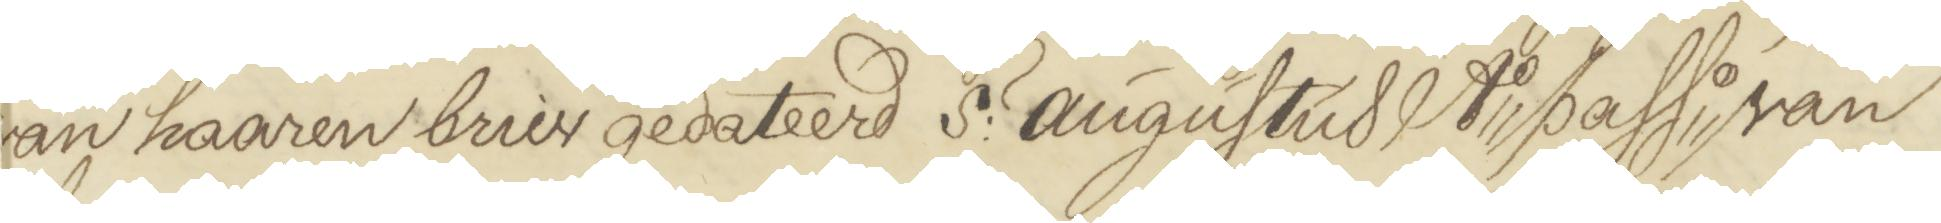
van haaren briev gedateerd 5: augustus A„o pass„o van
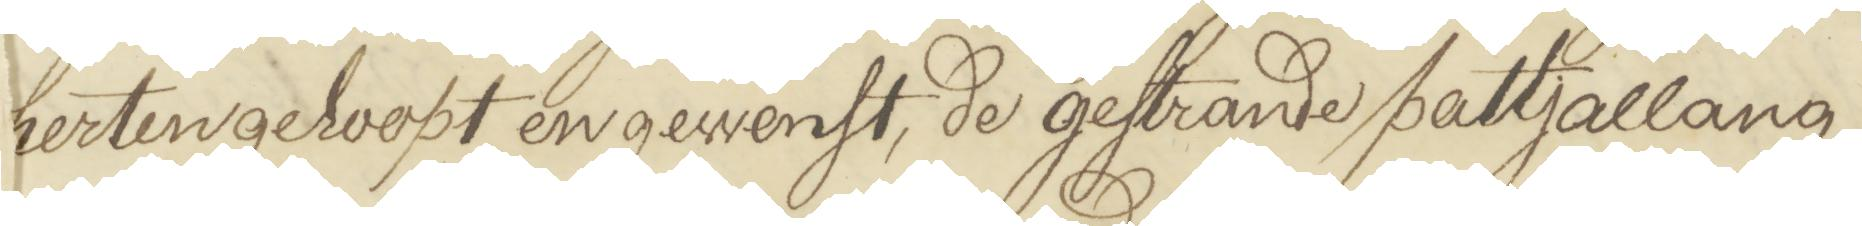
herten gehoopt en gewenst, de gestrande pattjallang
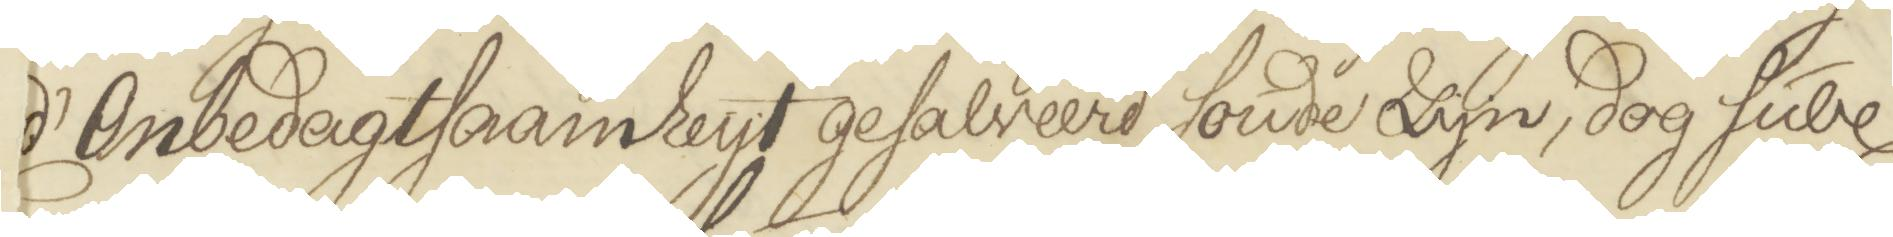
d' Onbedagtsaamheijt gesalveerd soude Zijn, dog sulx
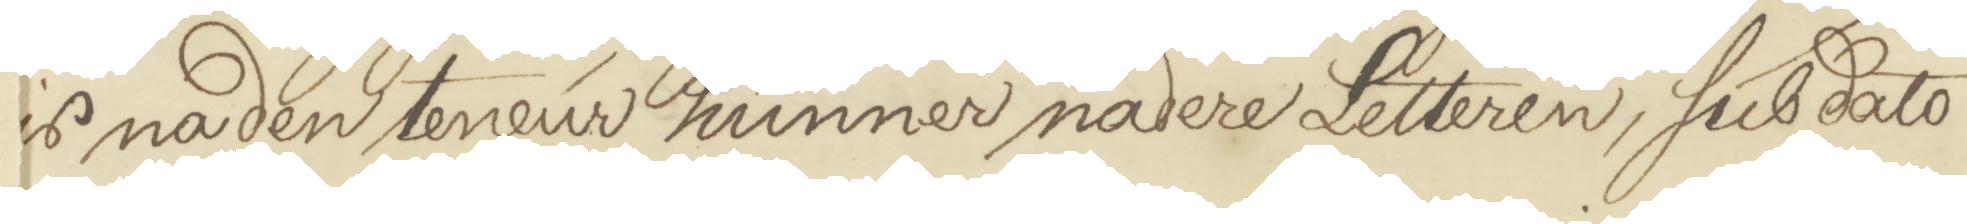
is na den teneur hunner nadere Letteren, Sub dato
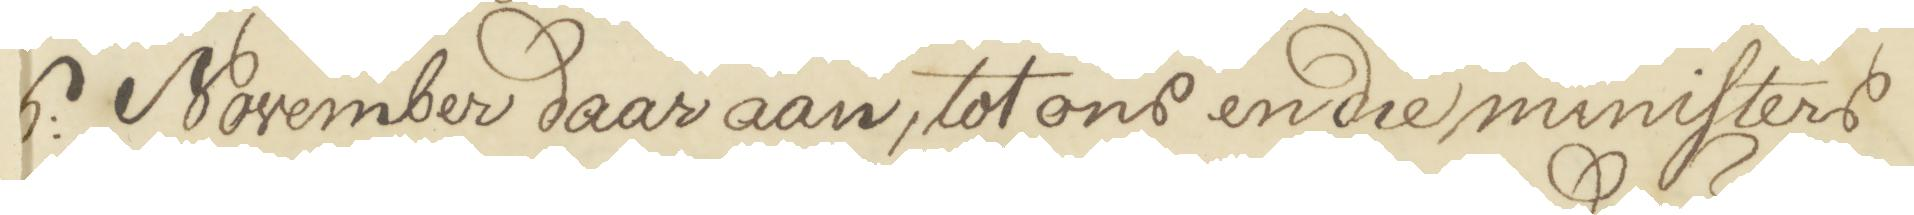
6: November daar aan, tot ons en die ministers
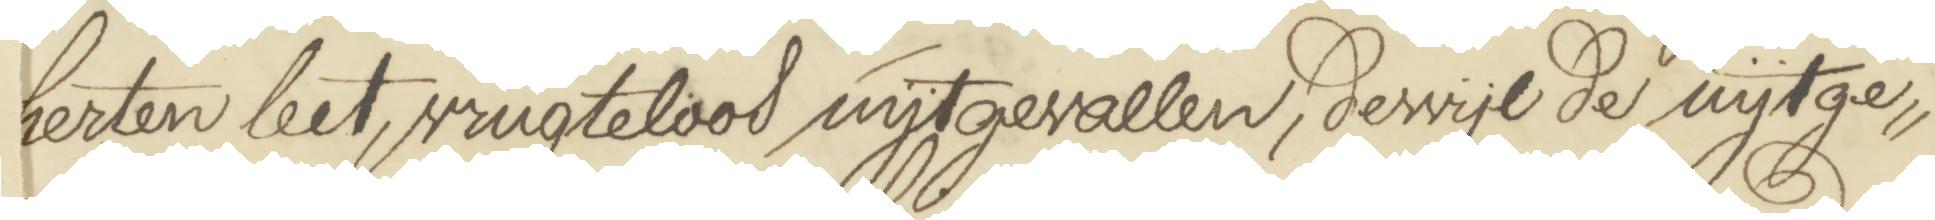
herten leet, vrugteloos uijtgevallen, dewijl de uijtge„
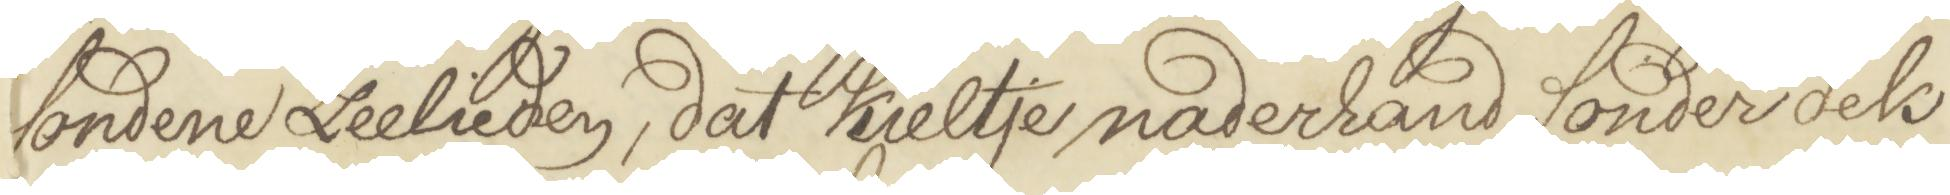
sondene Zeelieden, dat Kieltje naderhand Sonder dek
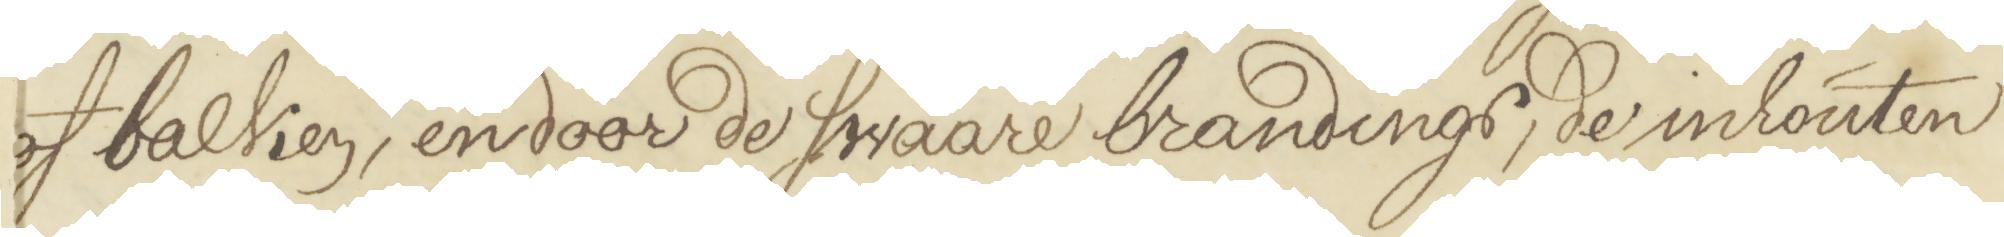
of balken, en door de Swaare brandings, de inhouten
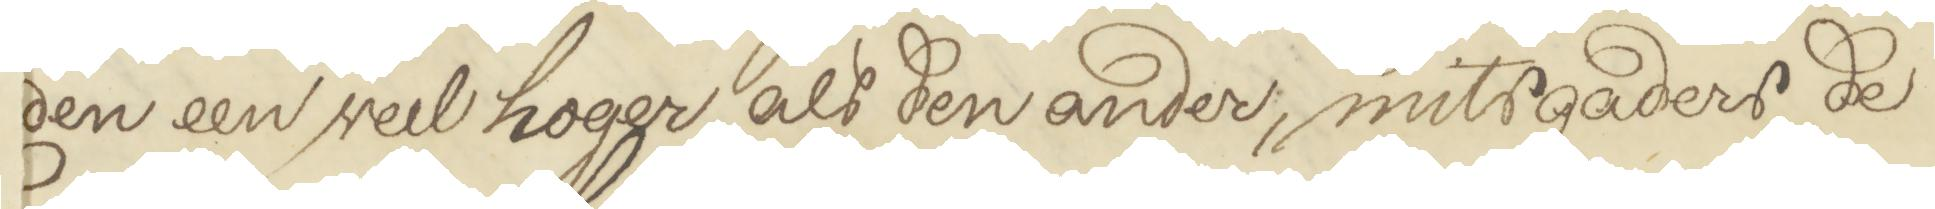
den een veel hoger als den ander, mitsgaders de
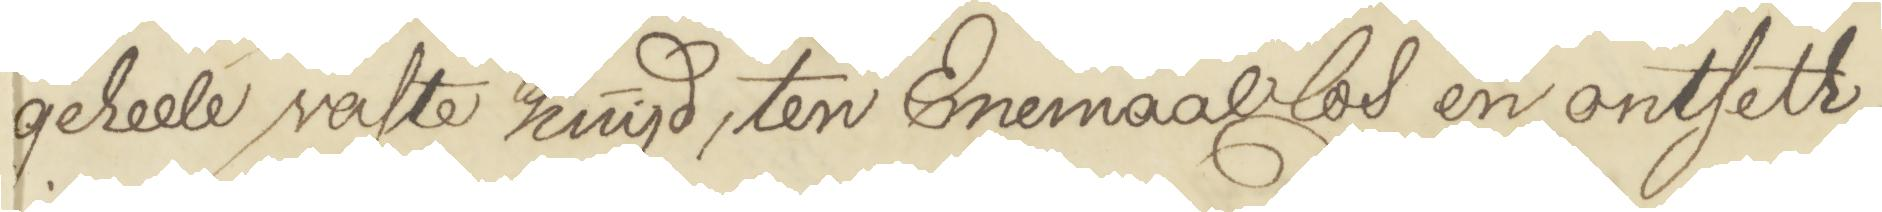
geheele vaste huijd, ten Enemaal los en ontseth,
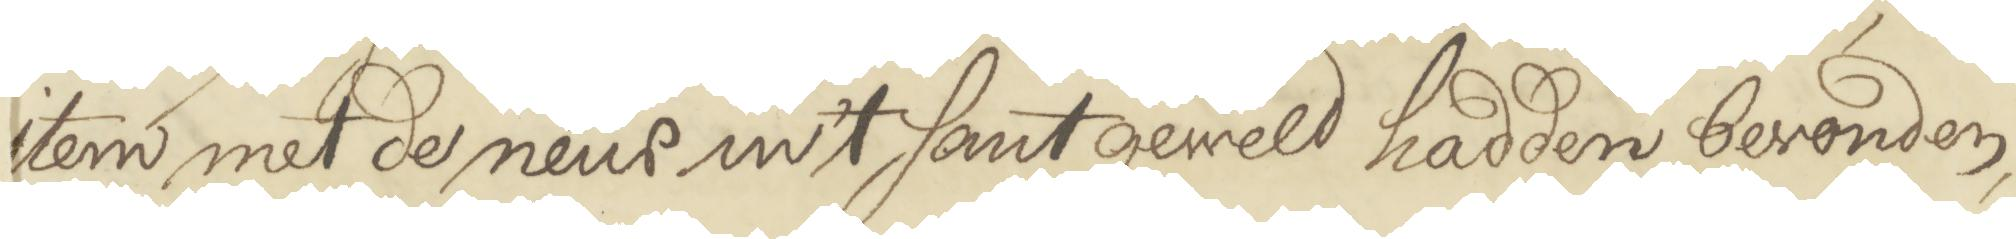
item met de neus in ’t Sant geweld hadden bevonden,
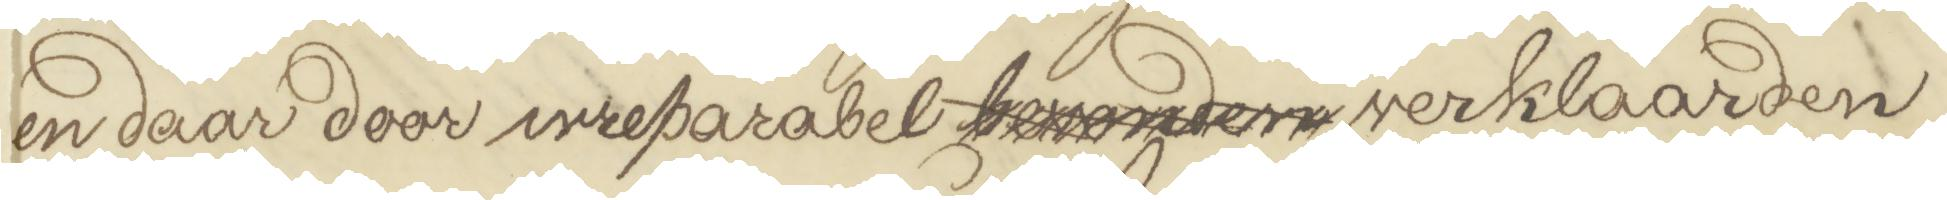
en daar door irreparabel bevonden verklaarden
